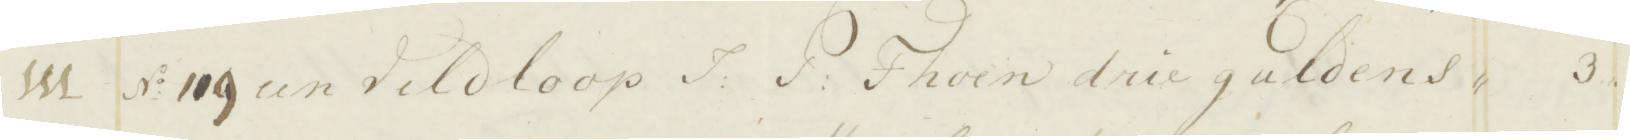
111 N=o 119 een Veldloop J: P: Fhoen drie guldens„ 3„
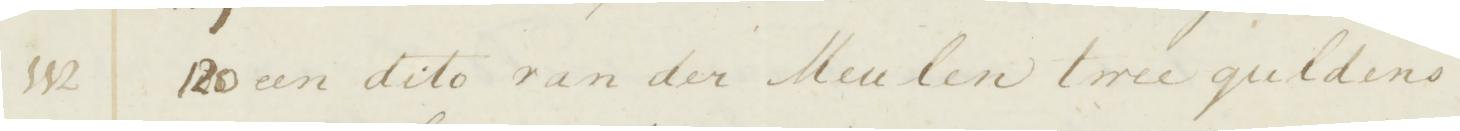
112 120 een dito van der Meulen twee guldens
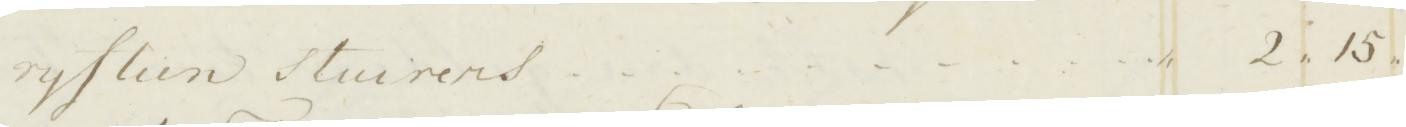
vijftien stuivers . . . . . . . . . . . „ 2„ 15„
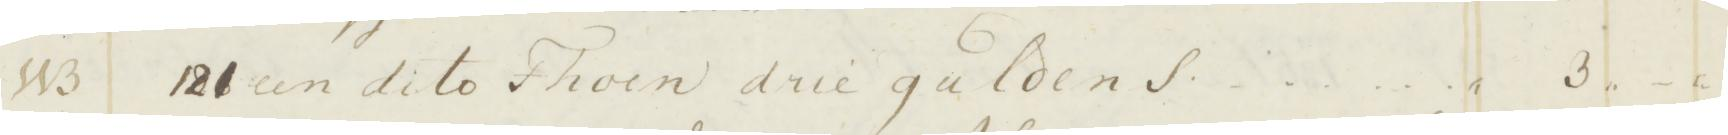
113 121 een dito Fhoen drie guldens. . . . . . . 3„ _ „
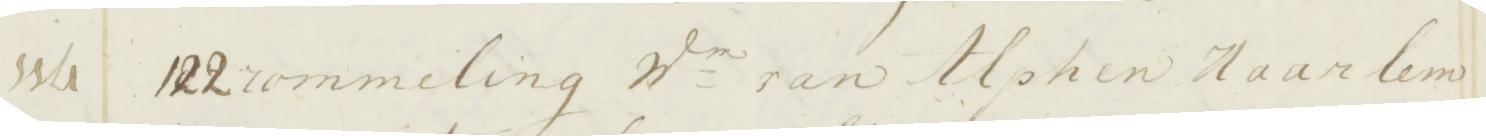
114 122 rommeling W=m van Alphen Haarlem
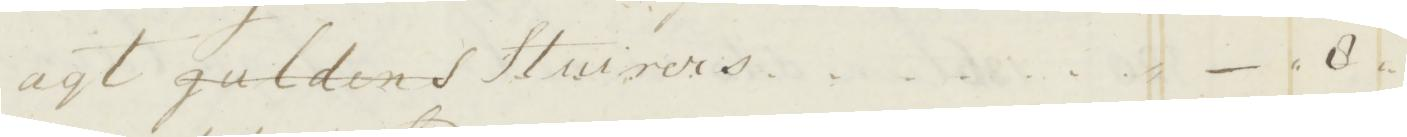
agt guldens Stuivers . . . . . . . „ _ „ 8 „
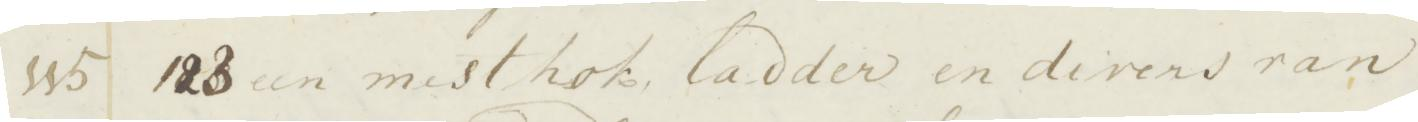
115 123 een mesthok, ladder en divers van
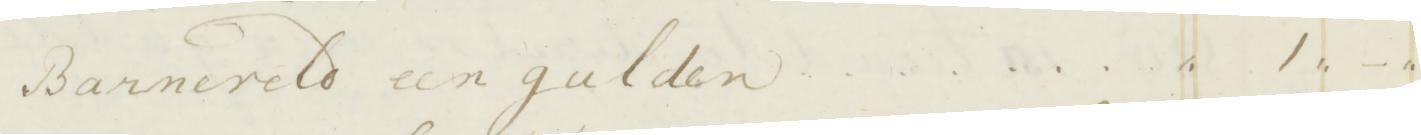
Barneveld een gulden . . . . . . . . „ 1„ — „
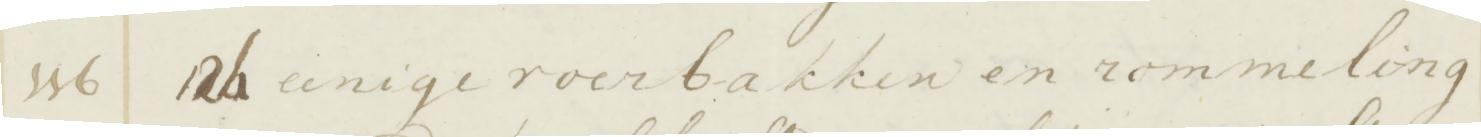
116 124 eenige voerbakken en rommeling
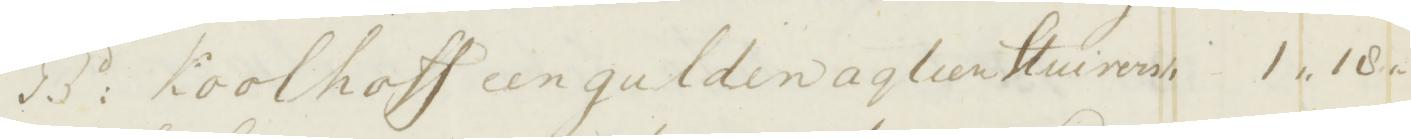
B:d Koolhoff een gulden agtien Stuivers„ 1„ 18„
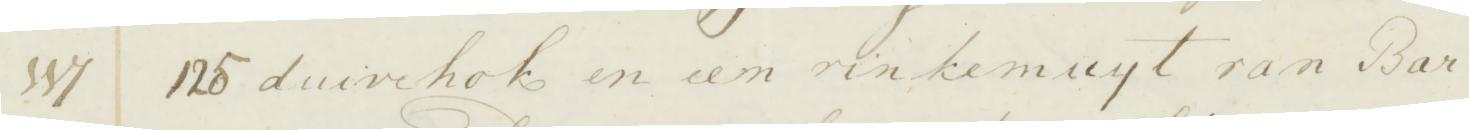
117 125 duivehok en een vinkemuyt van Bar
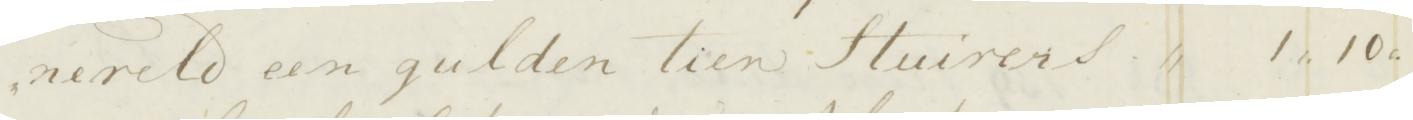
„neveld een gulden tien stuivers .„ 1„ 10„
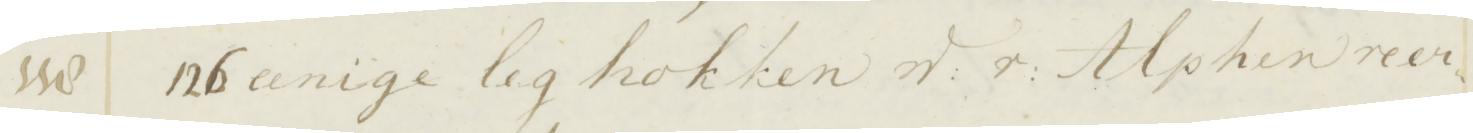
118 126 eenige leg hokken w: v: Alphen veer„
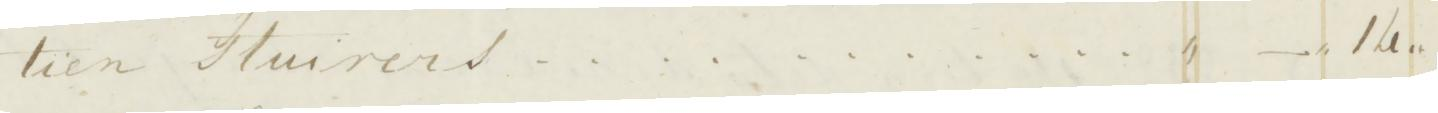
tien stuivers . . . . . . . . . . . „ „14„
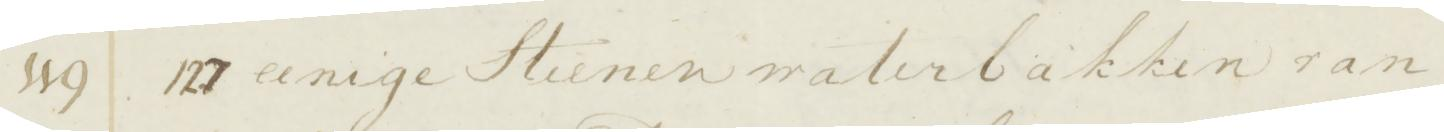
119 127 eenige steenen waterbakken van
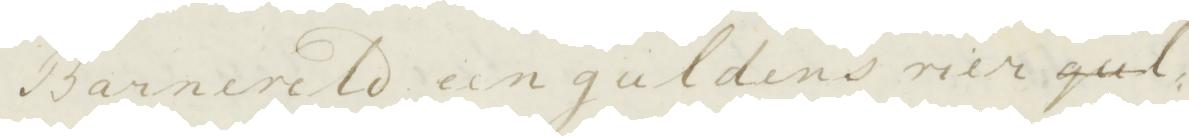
Barneveld een guldens vier gul„
